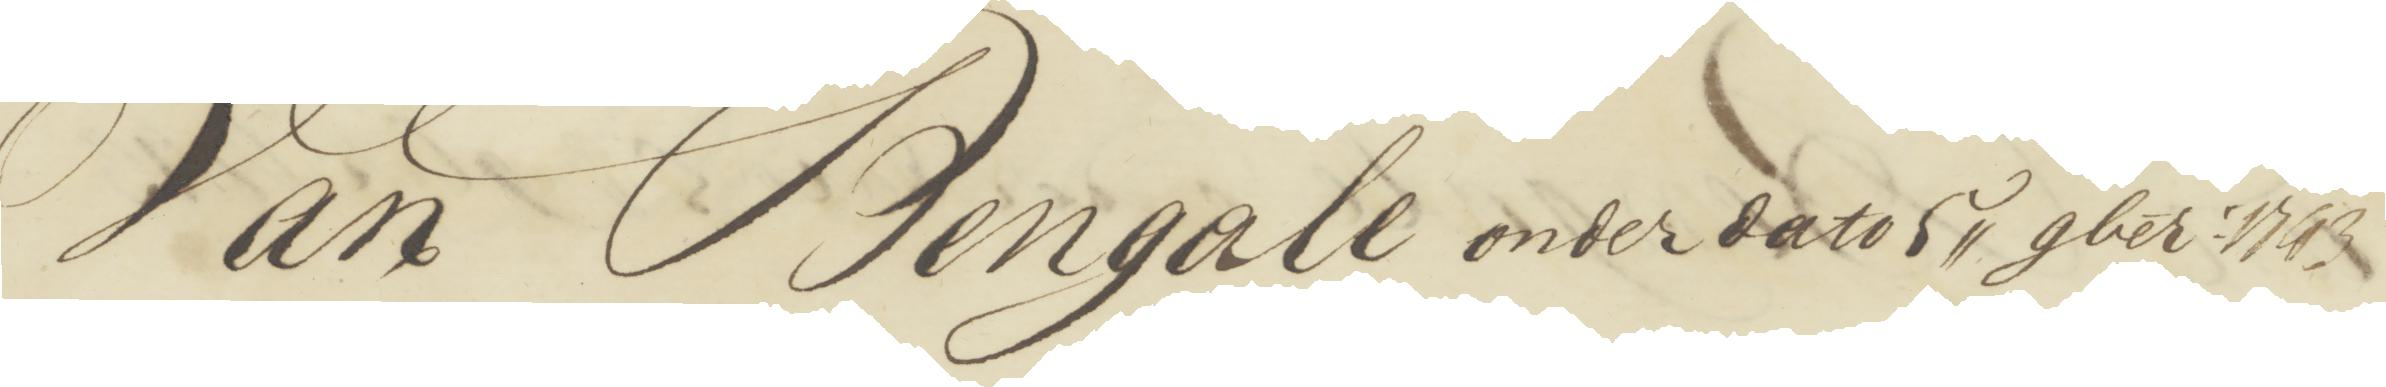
Van Bengale onder dato 5„e 9ber: 1743
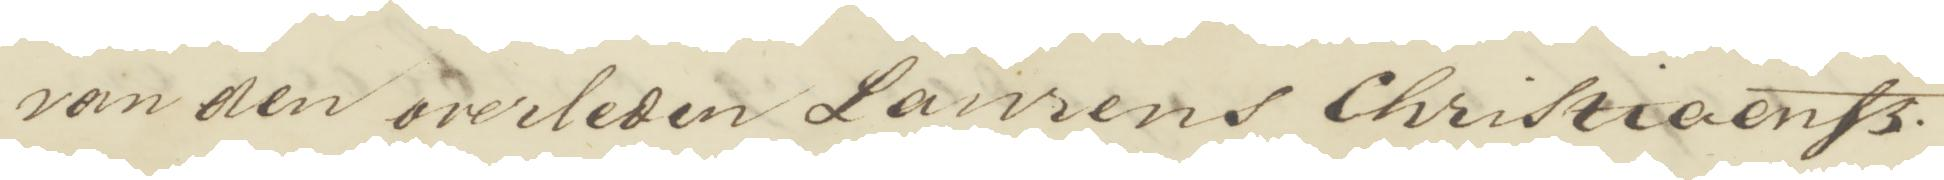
van den overleden Laurens Christiaensz.
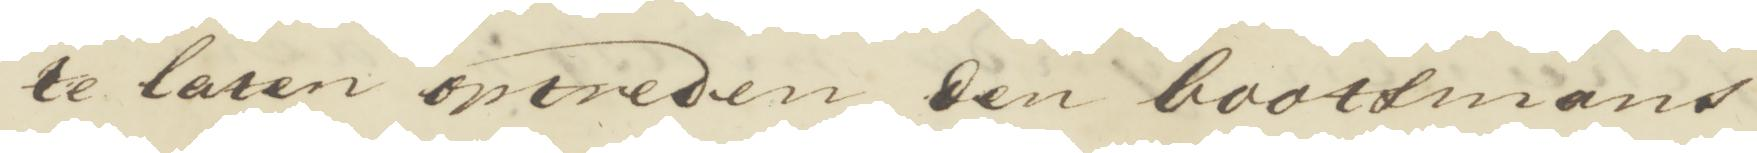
te laten optreden den bootsmans
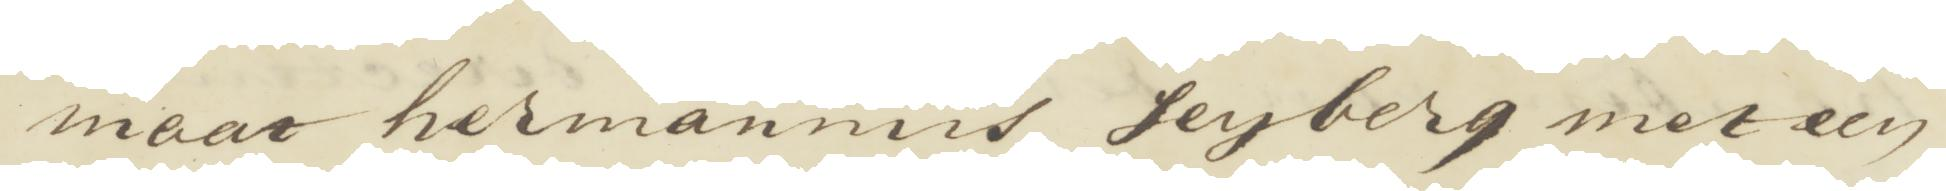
maat hermannus seyberg met een
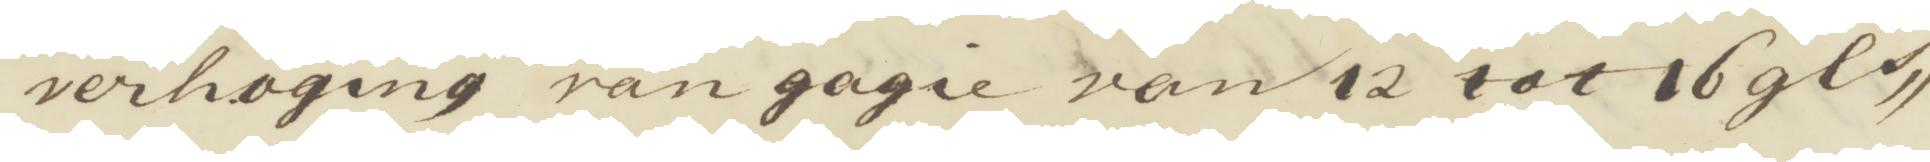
verhoging van gagie van 12 tot 16 gl„s
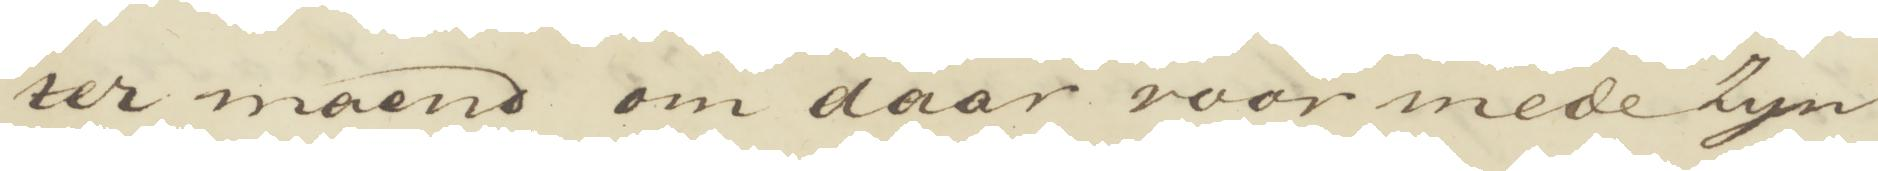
ter maend om daar voor mede Zyn
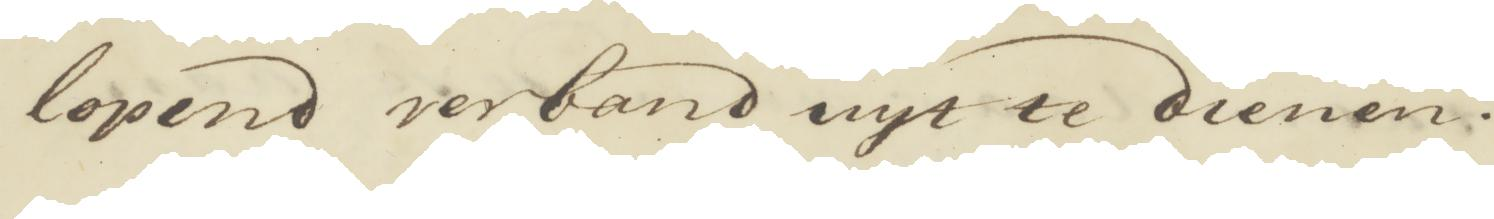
lopend verband uyt te dienen.
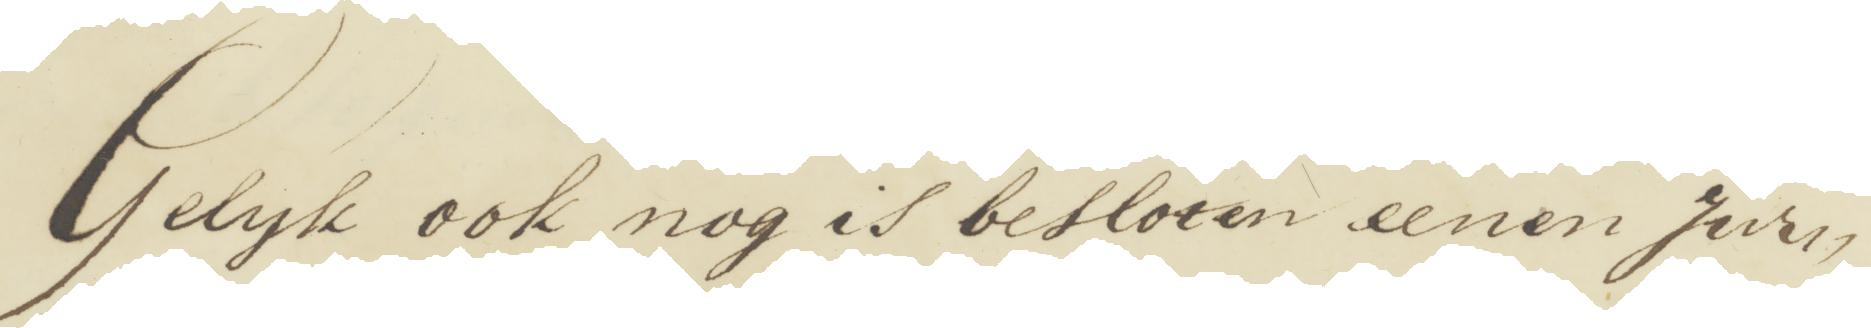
Gelyk ook nog is besloten eenen Jur„
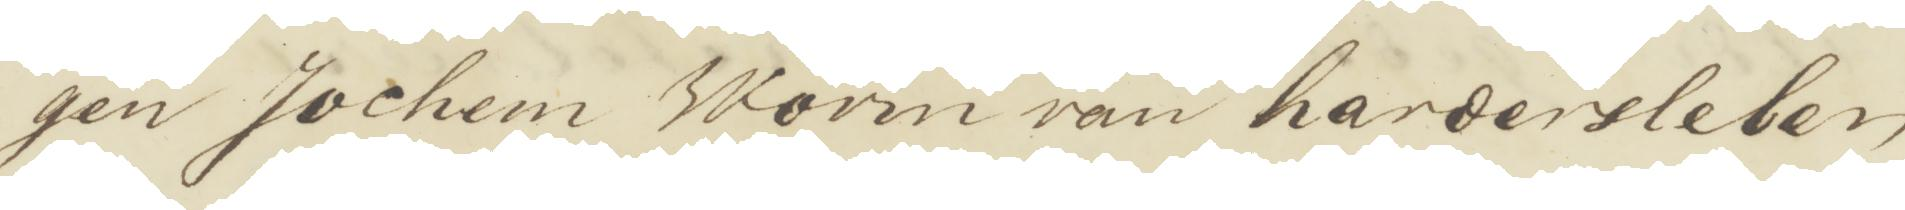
gen Jochem Worm van hardersleben
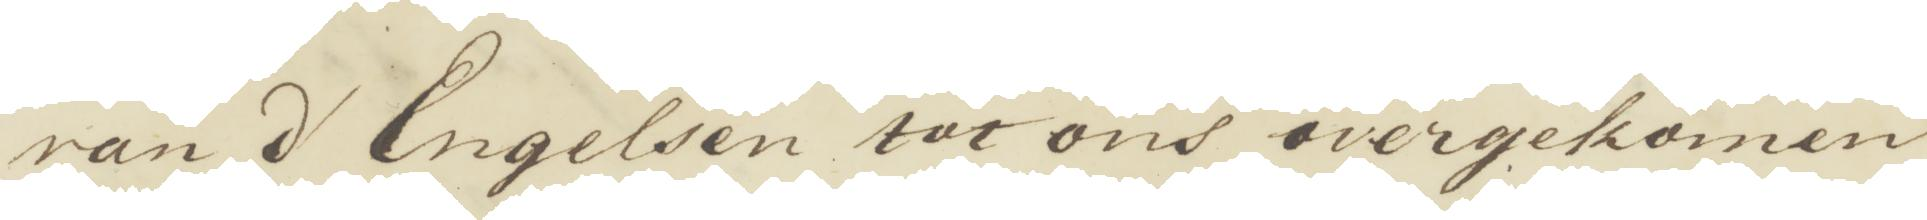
van d' Engelsen tot ons overgekomen
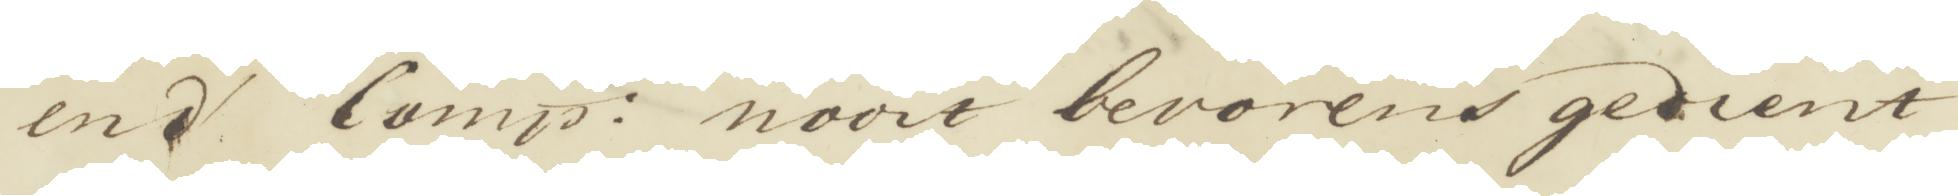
en d' Comp: nooit bevorens gedient
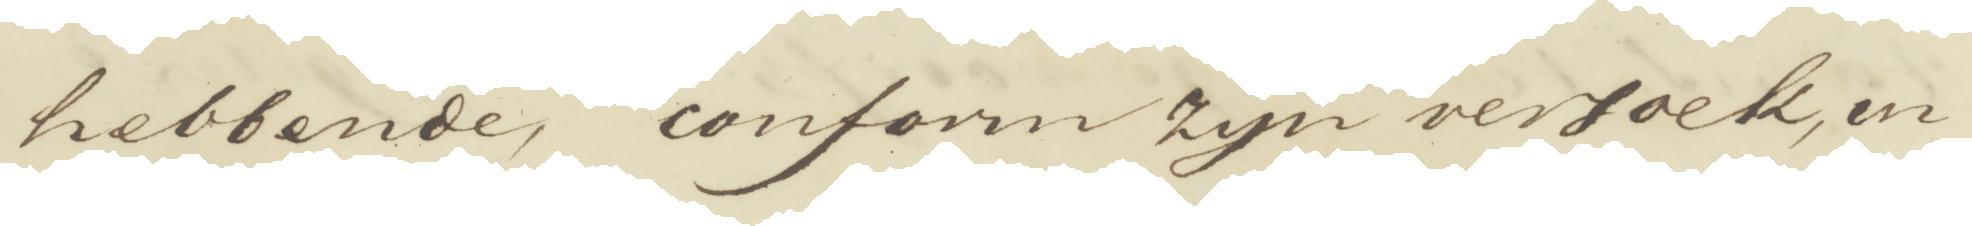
hebbende, conform zyn versoek, in
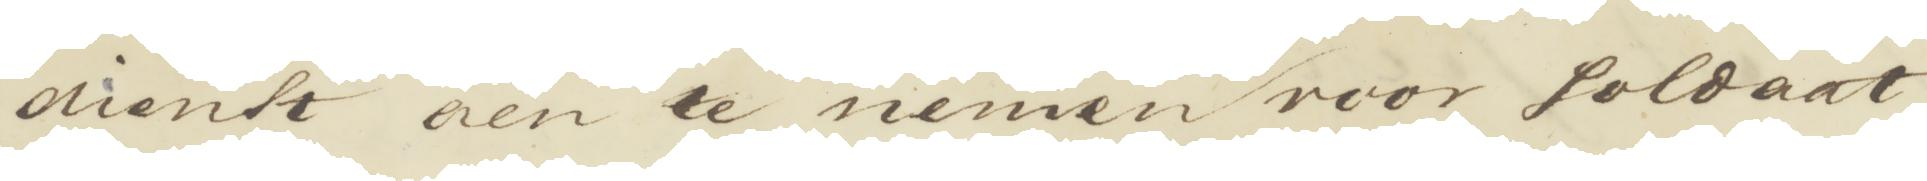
dienst aen te nemen voor soldaat
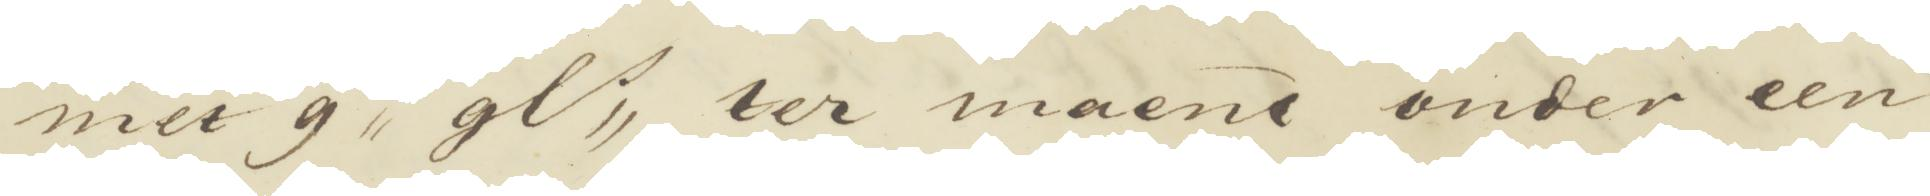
met 9„' gl„s ter maend onder een
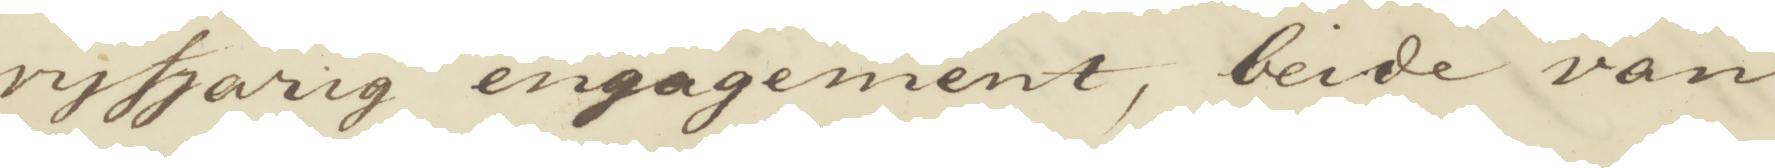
vyfjarig engagement, beide van
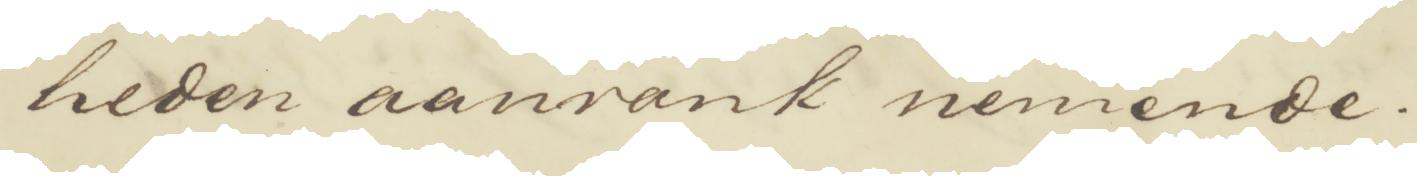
heden aanvank nemende.
